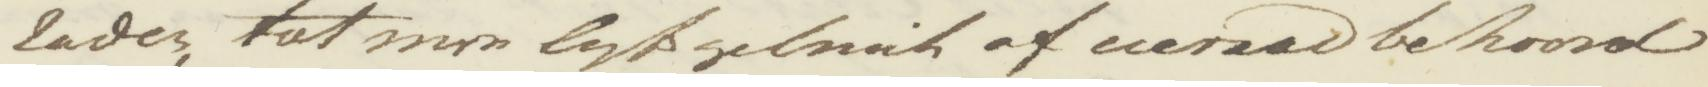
raden, tot myn lyf gebruik of cieraad behoord
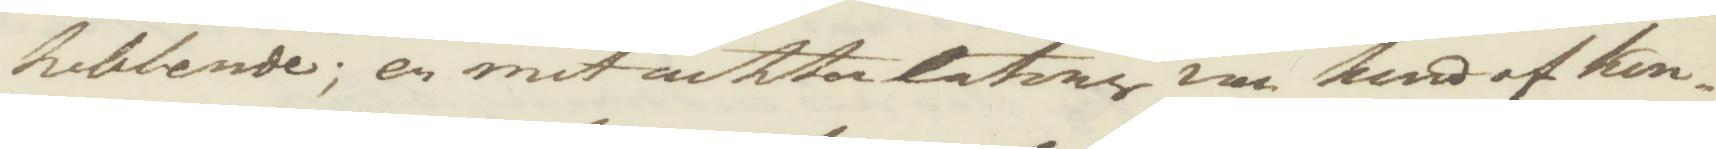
hebbende; en met achterlating van kind of kin„
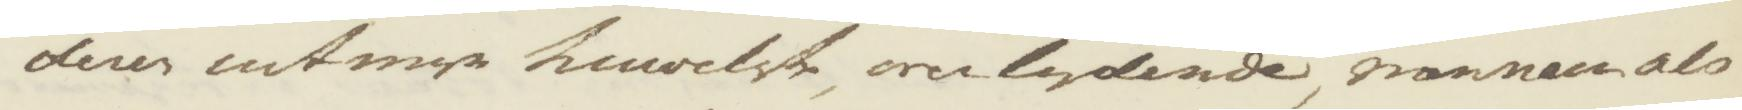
deren uit myn huwelyk, overlydende, wanneer als
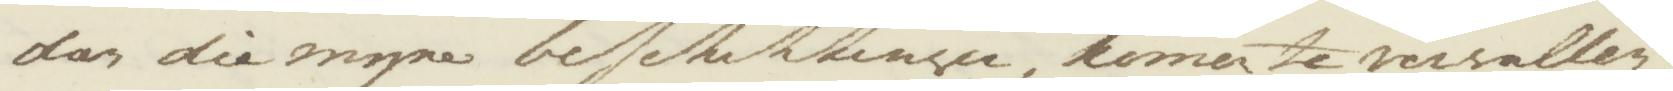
dan die myne beschikkingen, komen te vervallen,
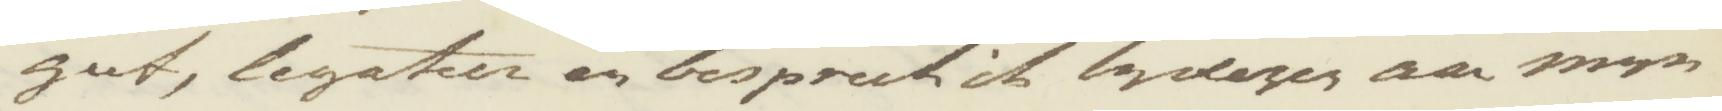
geef, legateer en bespreek ik by dezen aan myn
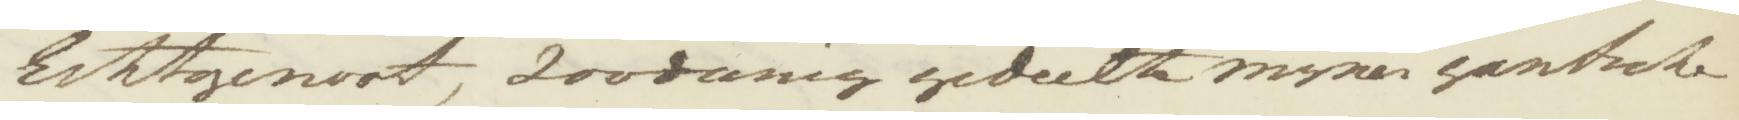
Echtgenoot, zoodanig gedeelte mynen gantsche
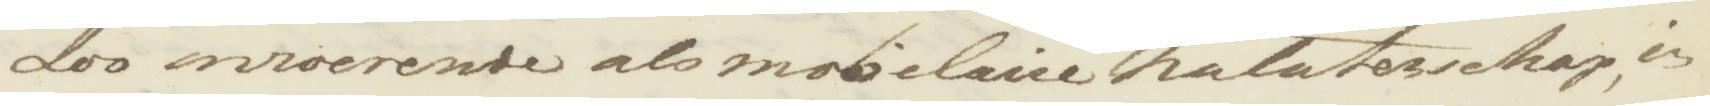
zoo onroerende als mobilaire Nalatenschap, in
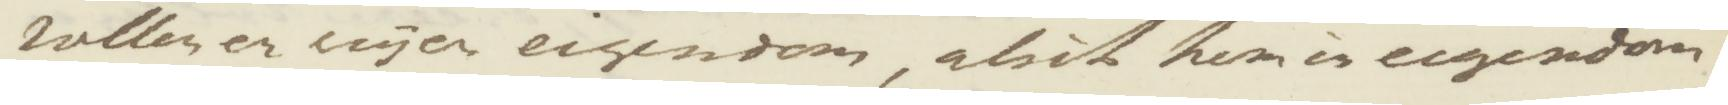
vollen en vrijen eigendom, als ik hem in eigendom
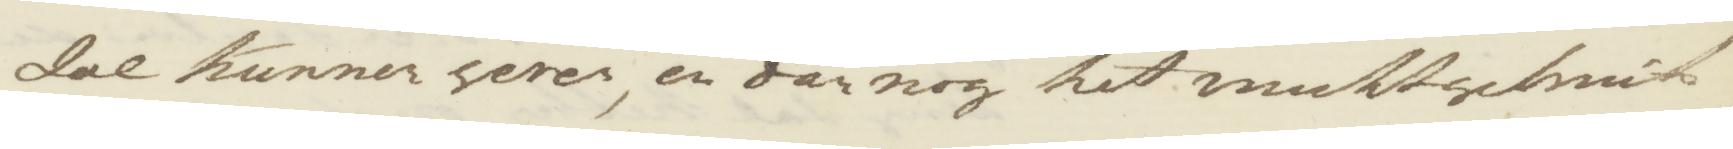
zal kunnen geven, en dan nog het vruchtgebruik
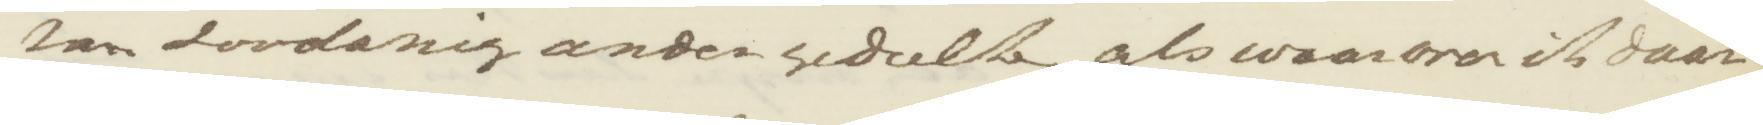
van zoodanig ander gedeelte als waarover ik daar
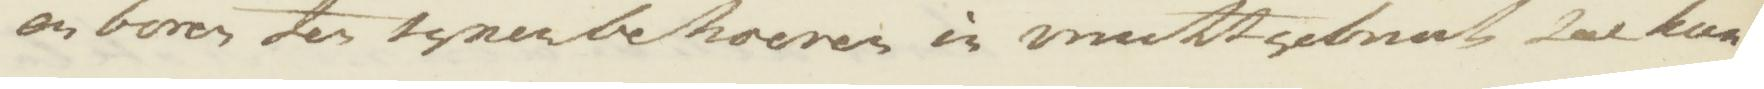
en boven ten zynen behoeven in vruchtgebruik zal kun
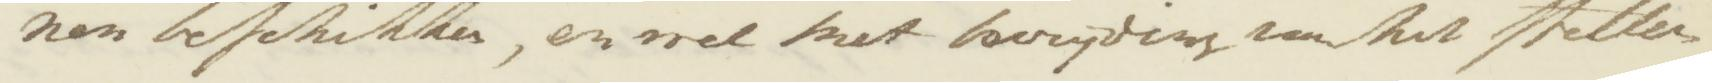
nen beschikken, en wel met bevrijding van het stellen
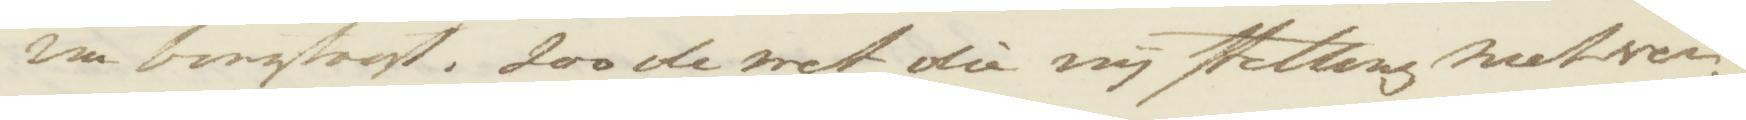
van borgtogt, zoo de wet die vrij stelling niet ver„
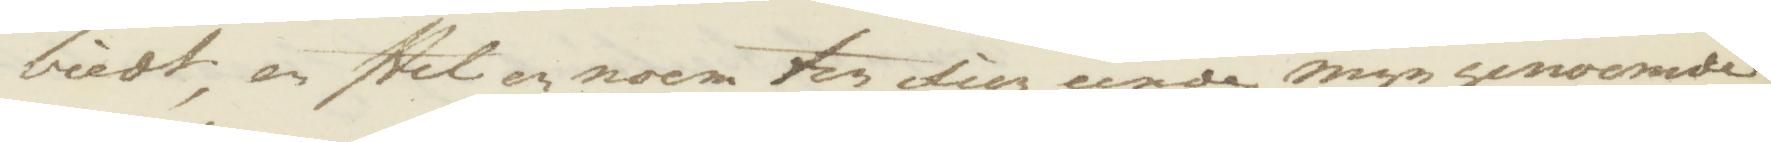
biedt, en stel en noem ten dien einde myn genoemde
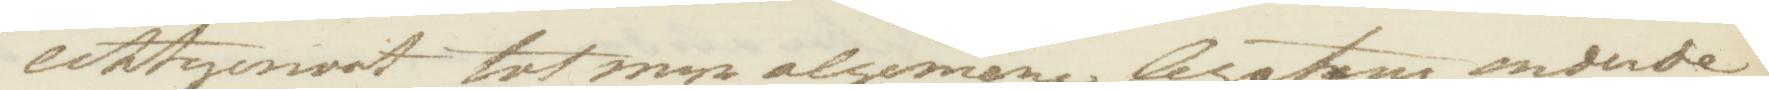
echtgenoot tot myn algemene legataris onder de
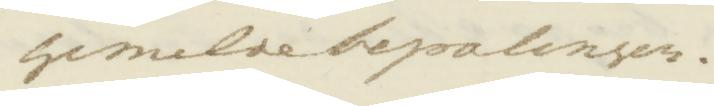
gemelde bepalingen
